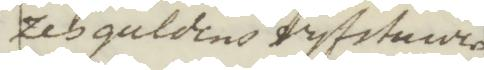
zes guldens vyf stuivrs
